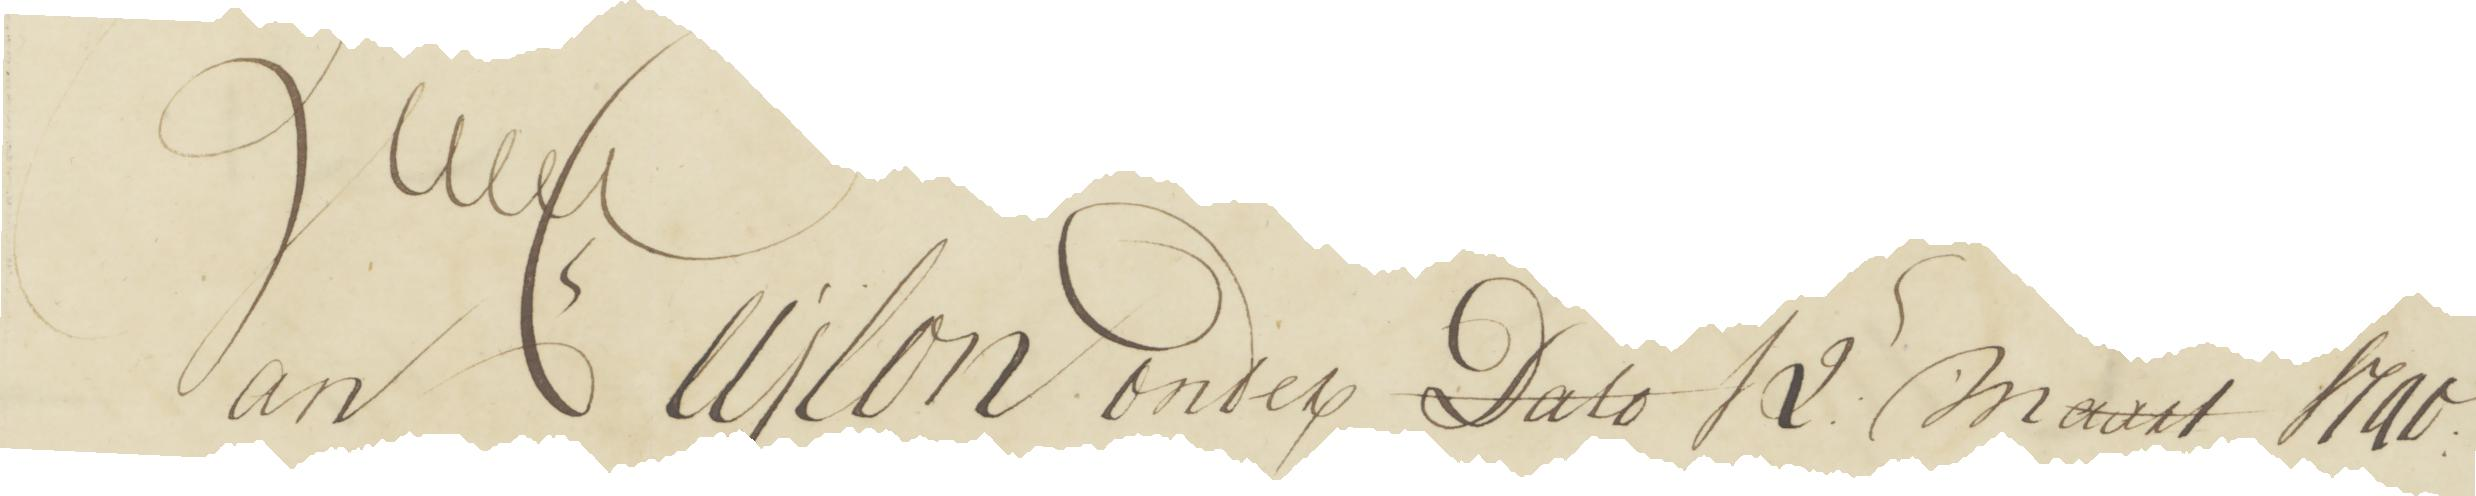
Van Ceijlon onder Dato 12:' Maart 1740:
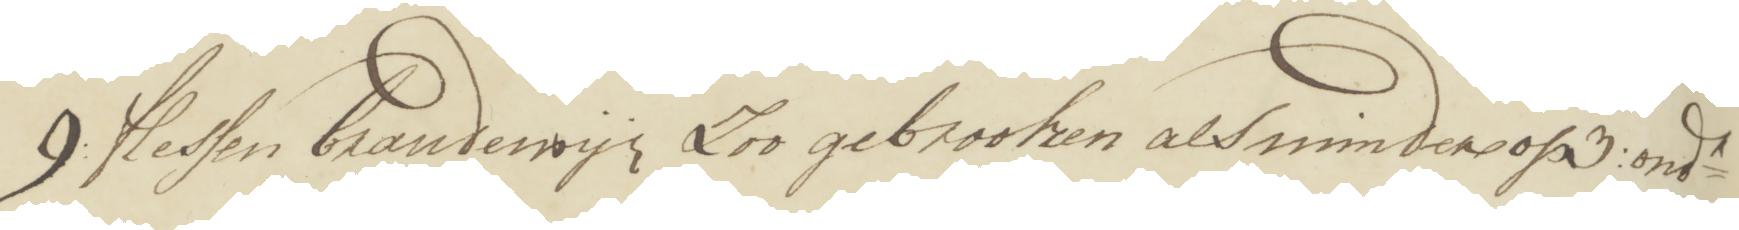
9: flessen brandewijn zoo gebrooken als minder op 3: ond=r
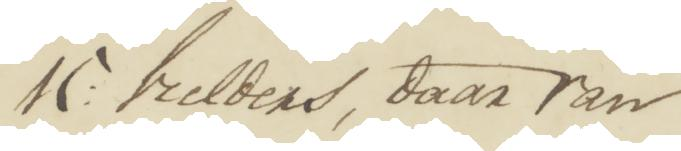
15: kelders, daar van
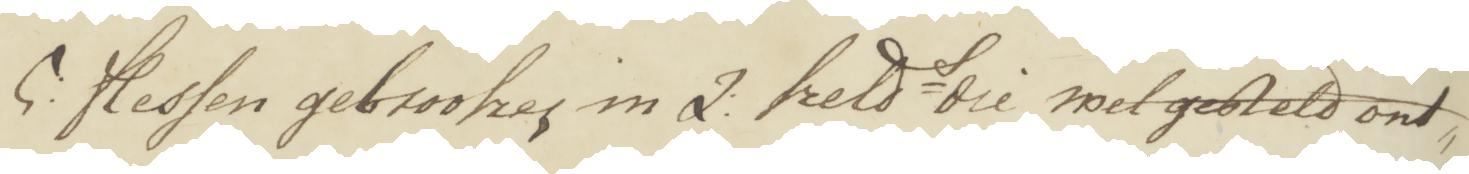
5: flessen gebrooken in 2: keld=s die wel gesteld ont„
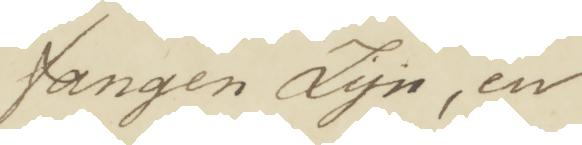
fangen zijn, en
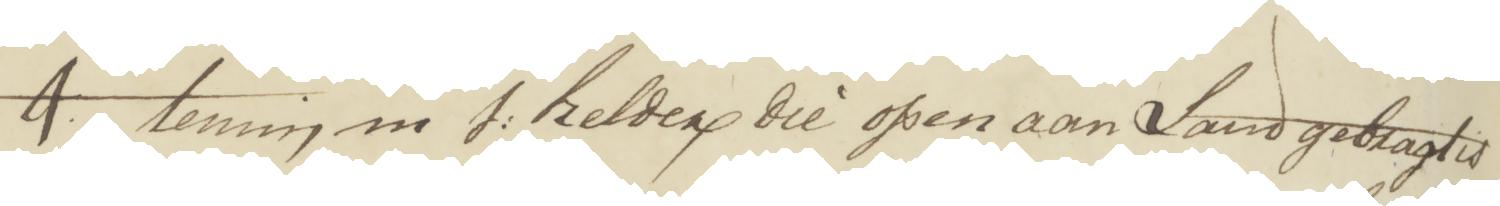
4: „ temin in s: kelder die open aan Land gebragt is
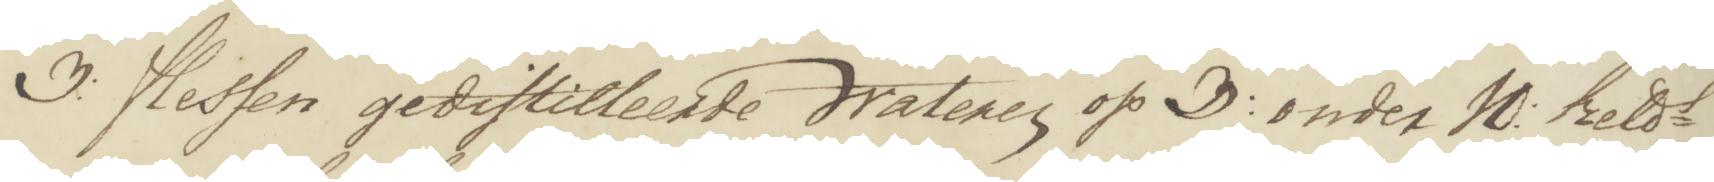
3: flessen gedistilleerde wateren op 3: onder 10: keld=s
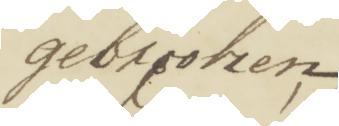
gebrooken
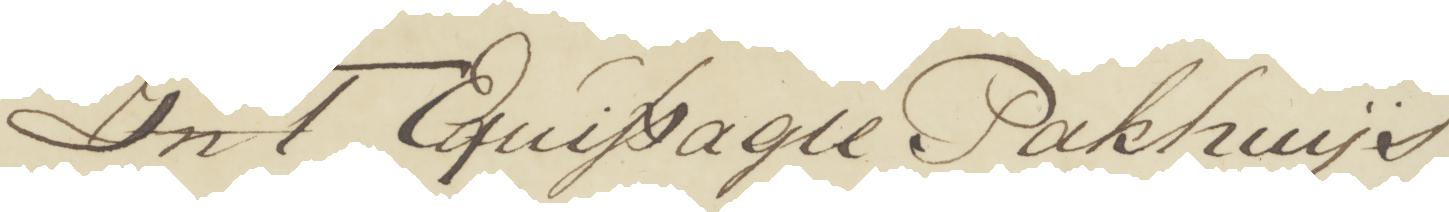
In ’t Equipagie Pakhuijs
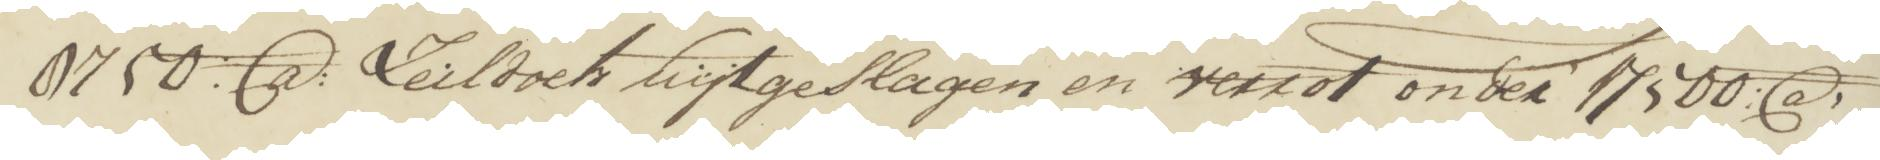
8750: Ca: Zeildoek uijtgeslagen en verrot onder 17500: Ca:
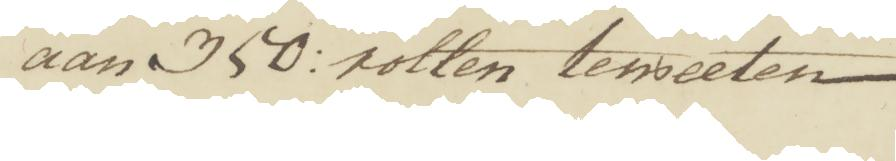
aan 350: rollen teweeten
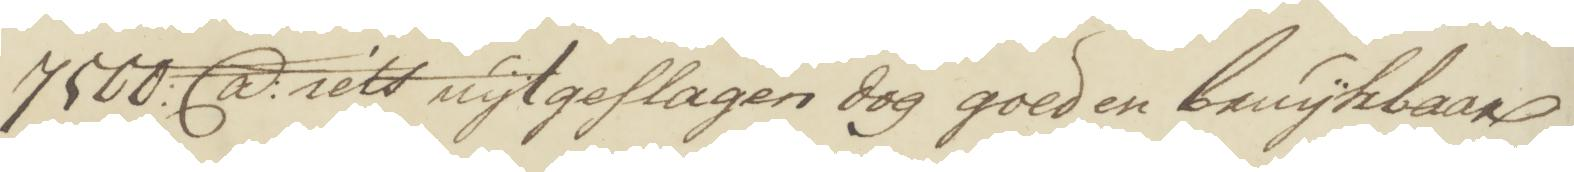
7500: Ca: iets uijtgeslagen dog goeden bruijkbaar
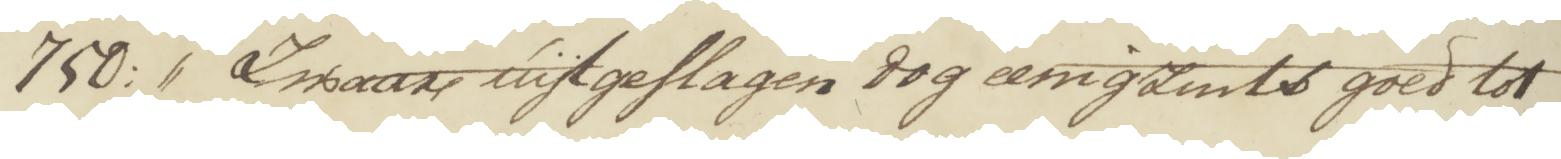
750: „ zwaar uijtgeslagen dog eenigzints goed tot
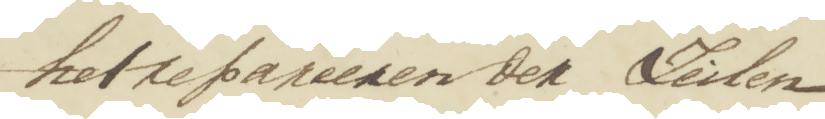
het repareeren der Zeilen
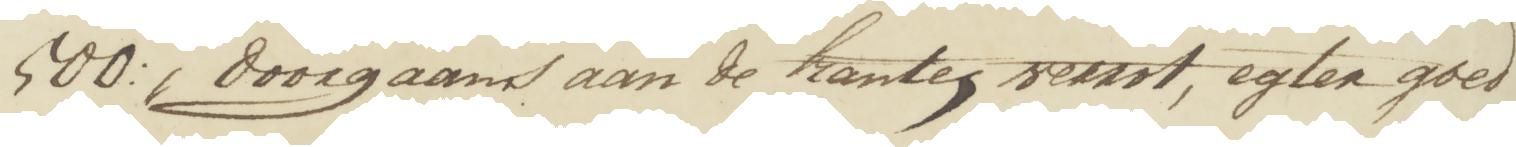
500: „ doorgaans aan de kanten verrot, egter goed
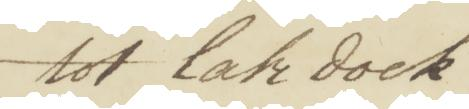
tot lak doek
